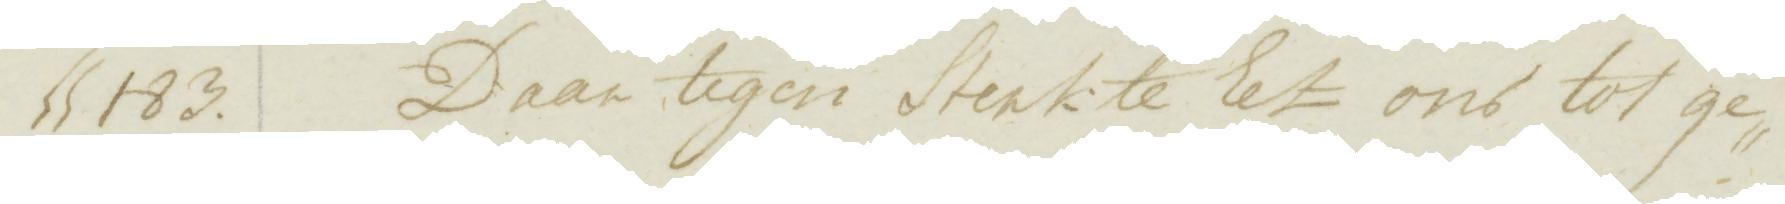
SS 183. Daar tegen sterkte het ons tot ge„
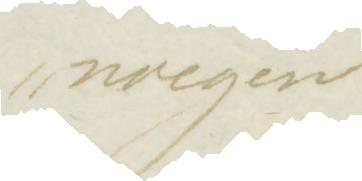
„noegen
